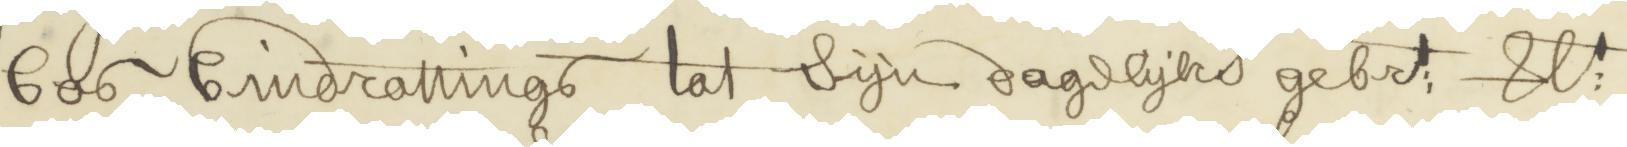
2: – gr: bos bindrottings tot sijn dagelijke gebr:t verl:t
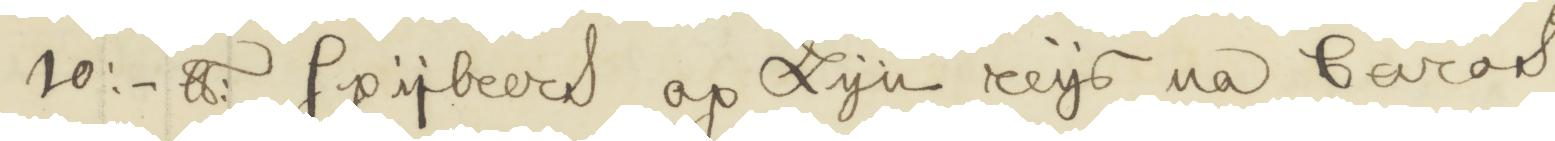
10 – lb: spijkers op zijn reijs na baros _:o
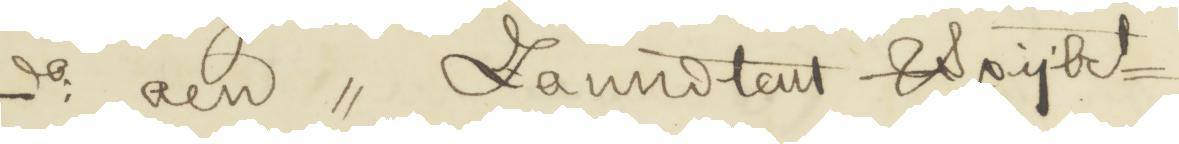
3: – „ _:o aen „ zonnetent verspijk=t
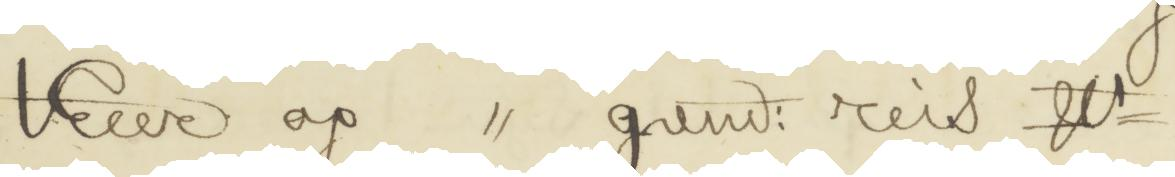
– 1/16. vat theer op „ gend: reis verl=t
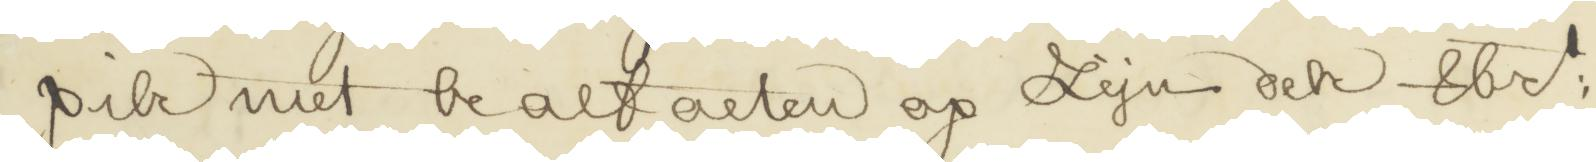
– 1/16. „ pik met kalfaeten op zijn dek verbr:t
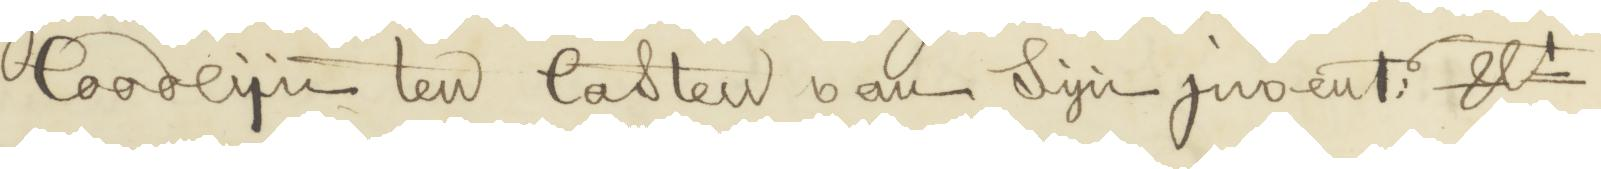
1: – p:s loodlijn ten lasten van sijn jnvent:s verl=t
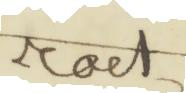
10: – lb: roet
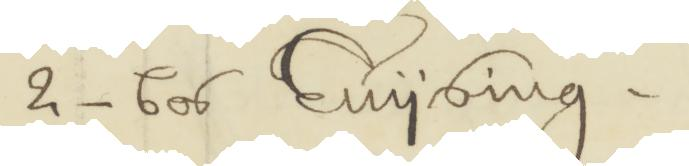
2 bos huijsing
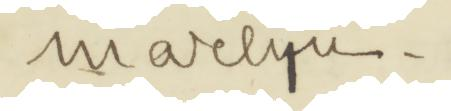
2: – „ marlijn
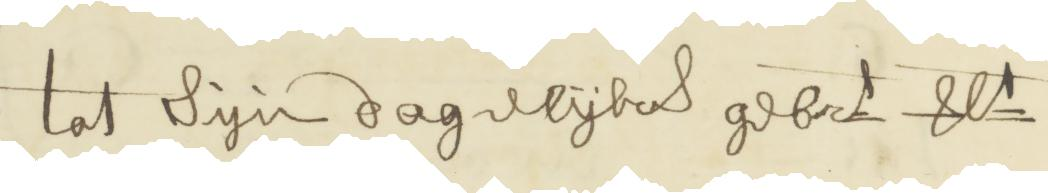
tot sijn dagelijke gebr=t verl=t
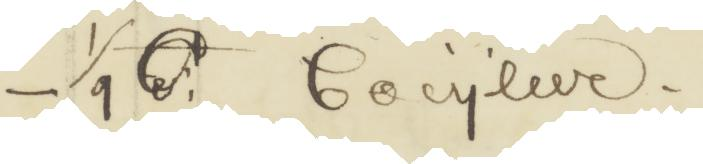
– ¼ h:t boeijleer
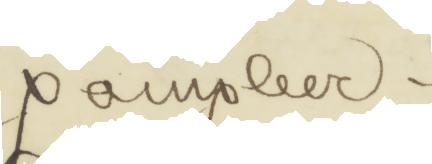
– ¼. „ pompleer
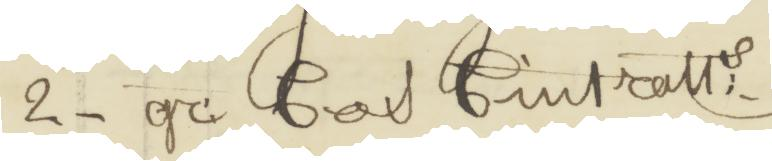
2 – gr: bos bintrott:s
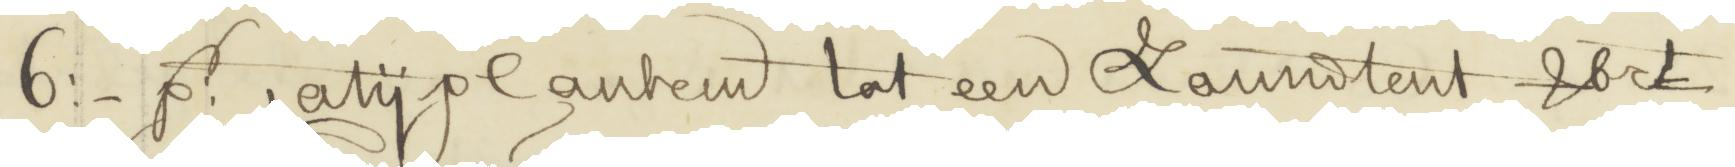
6: – p:s jatijplanken tot een zonnetent verbr=t
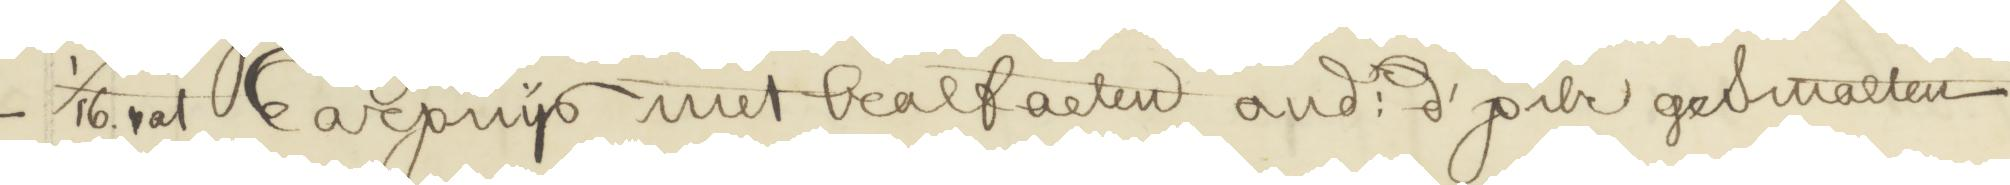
– 1/16. vat harpuijs met kalfaeten ond:r d’ pik gesmolten
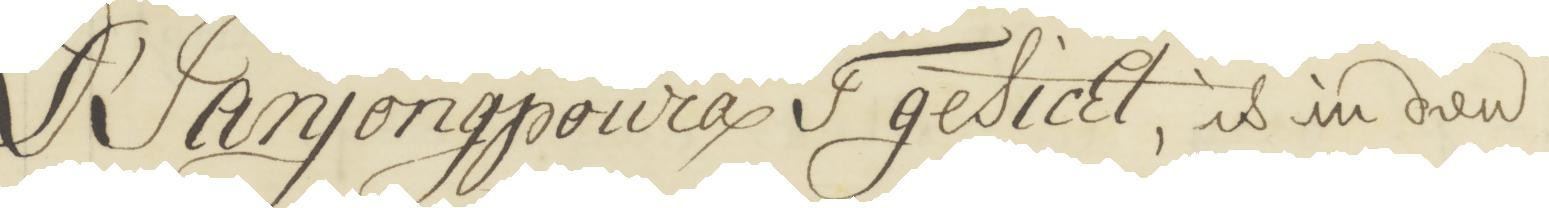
D' Tanjongpoura 'T gesicht, is en den
